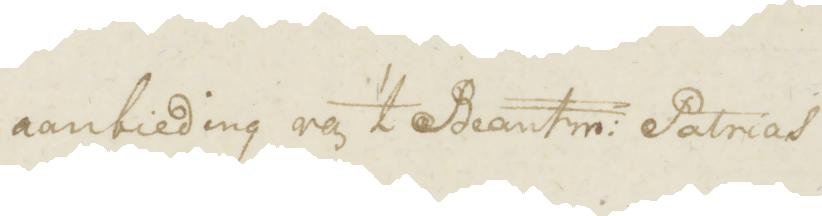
aanbieding van 't Beantw: Patrias
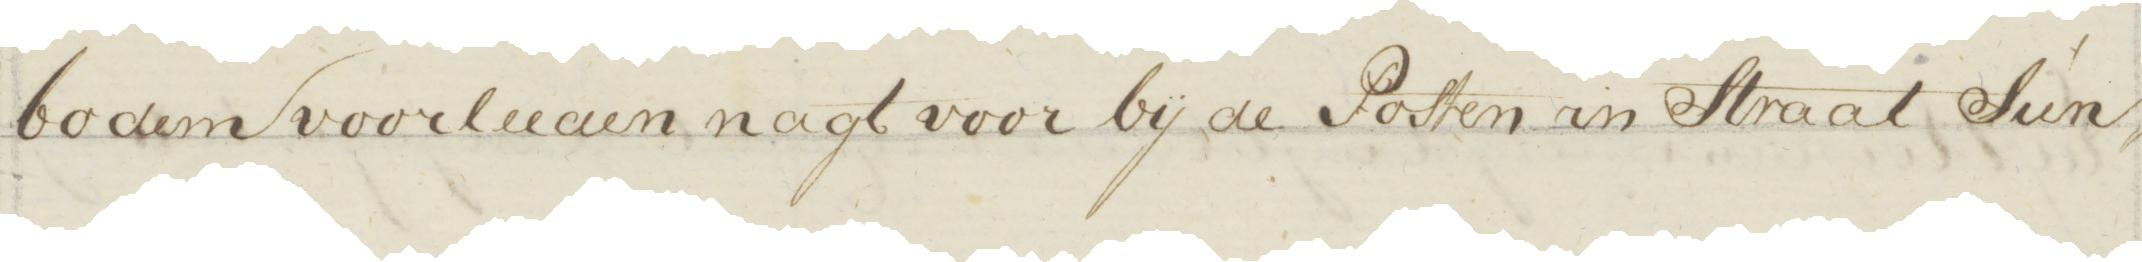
bodem voorleeden nagt voor bij de Posten in Straat Sun
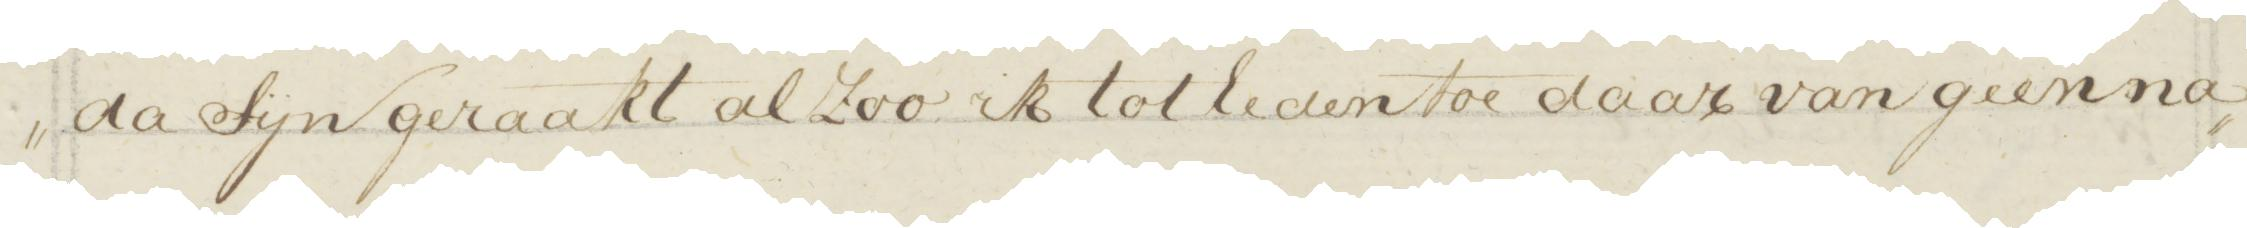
„da Sijn geraakt al zoo ik tot heden toe daar van geenna„
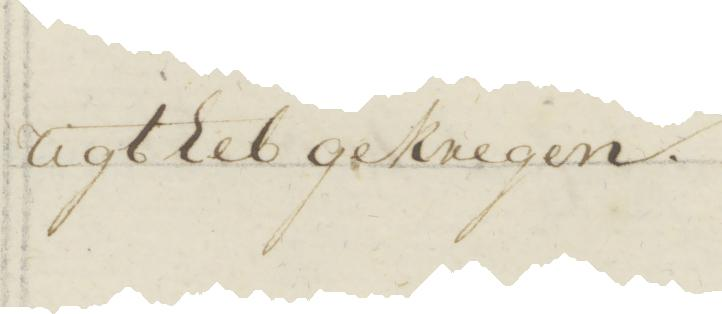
rigt heb gekregen.
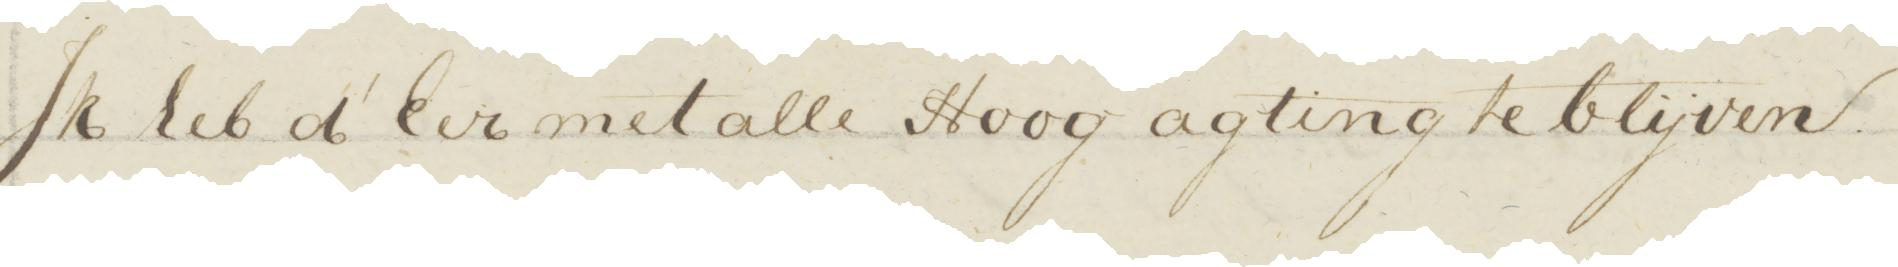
Ik heb d' Eer met alle Hoog agting te blijven
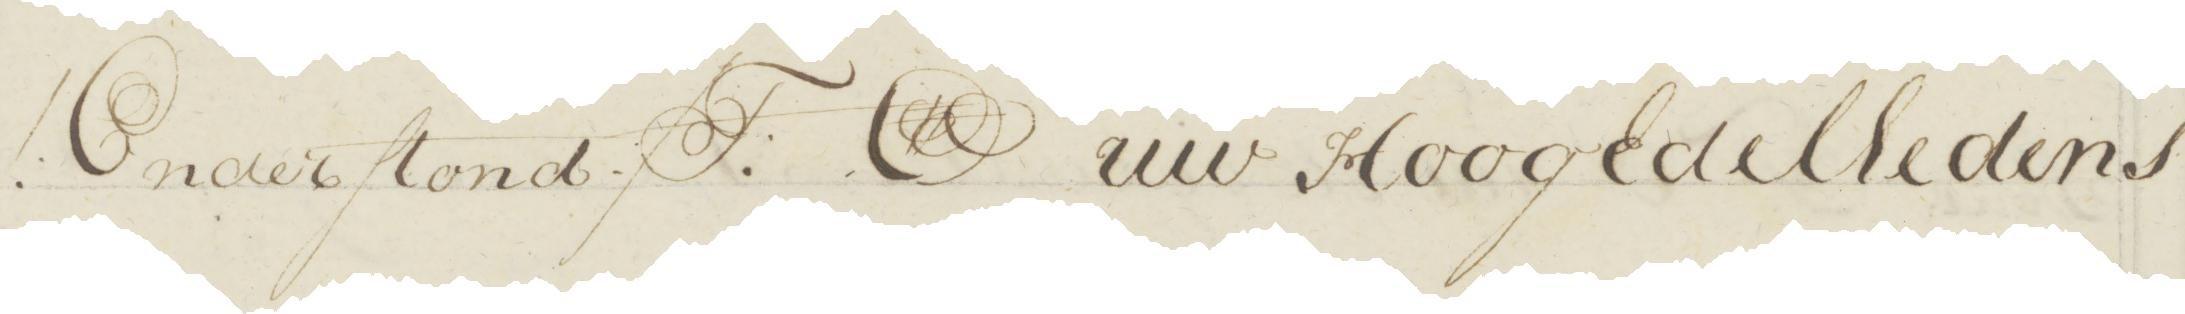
/:Onderstond:/ T: O uw Hoog Edelhedens
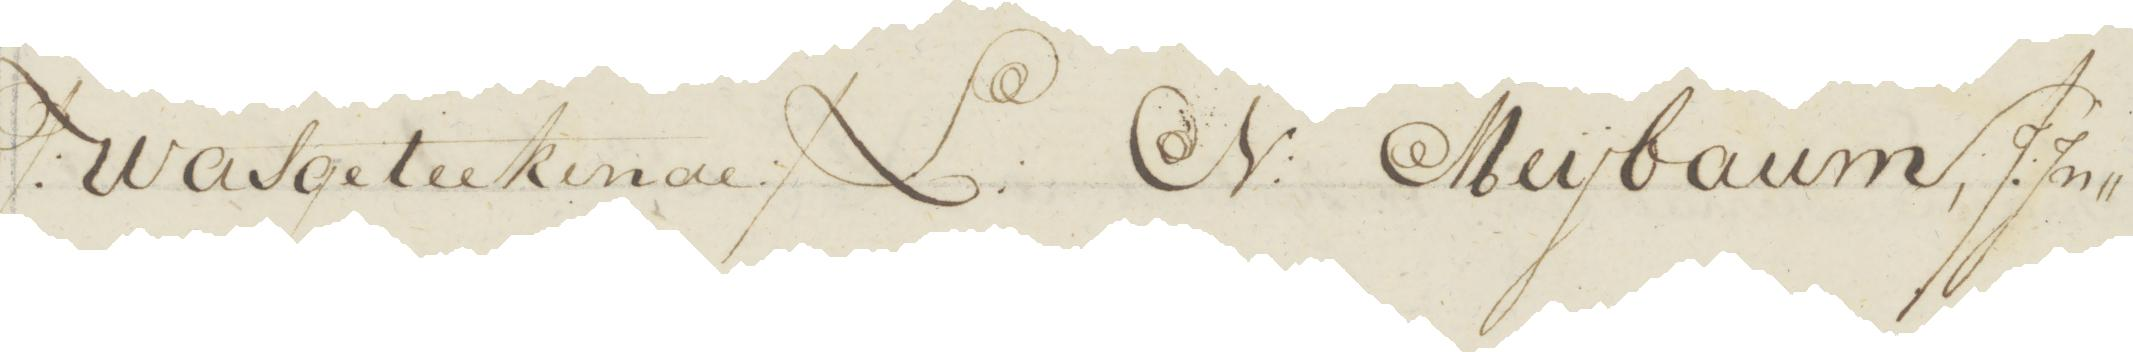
/:wasgeteekende:/ L: V: Meijbaum, /: Jn„
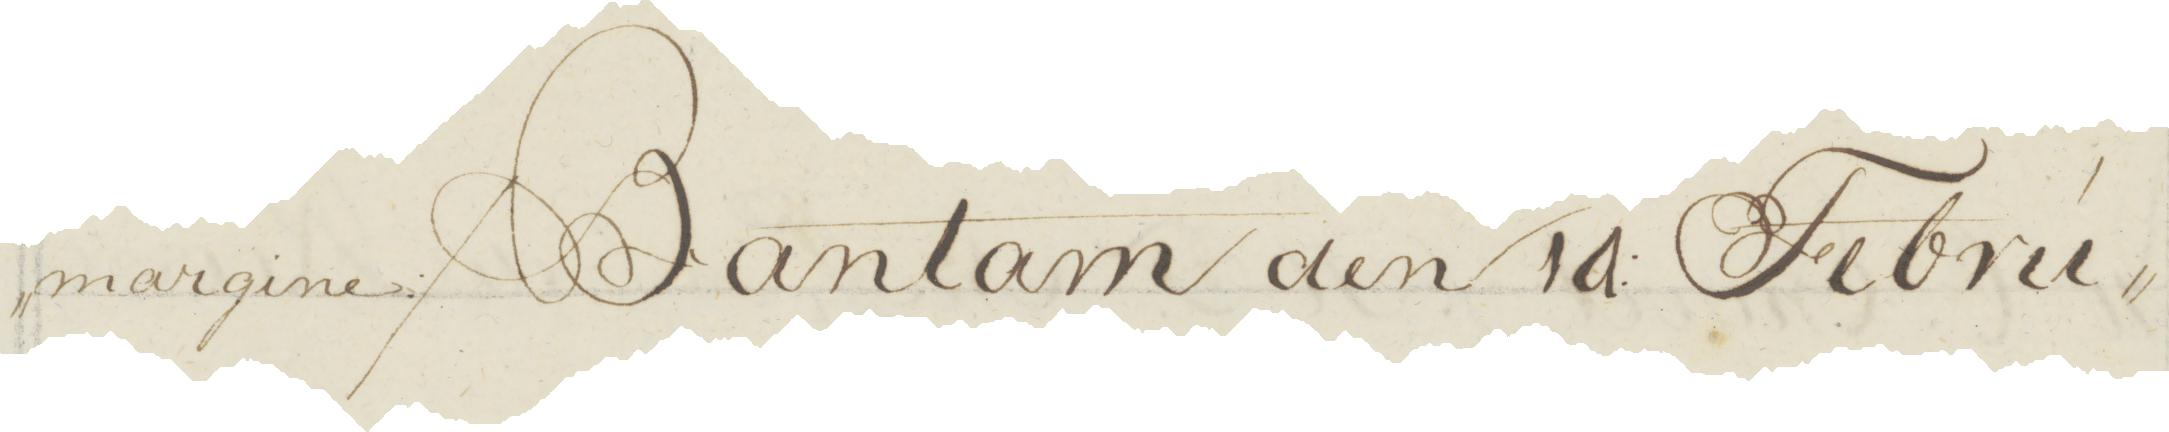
„margine:/ Bantam den 14: Febru„
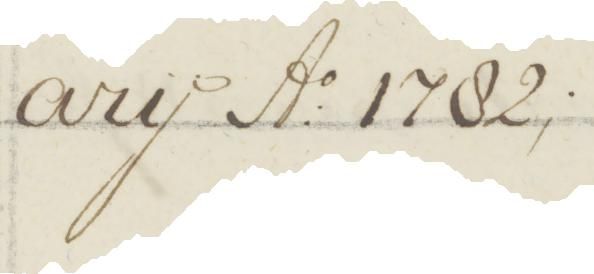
arij A:o 1782;
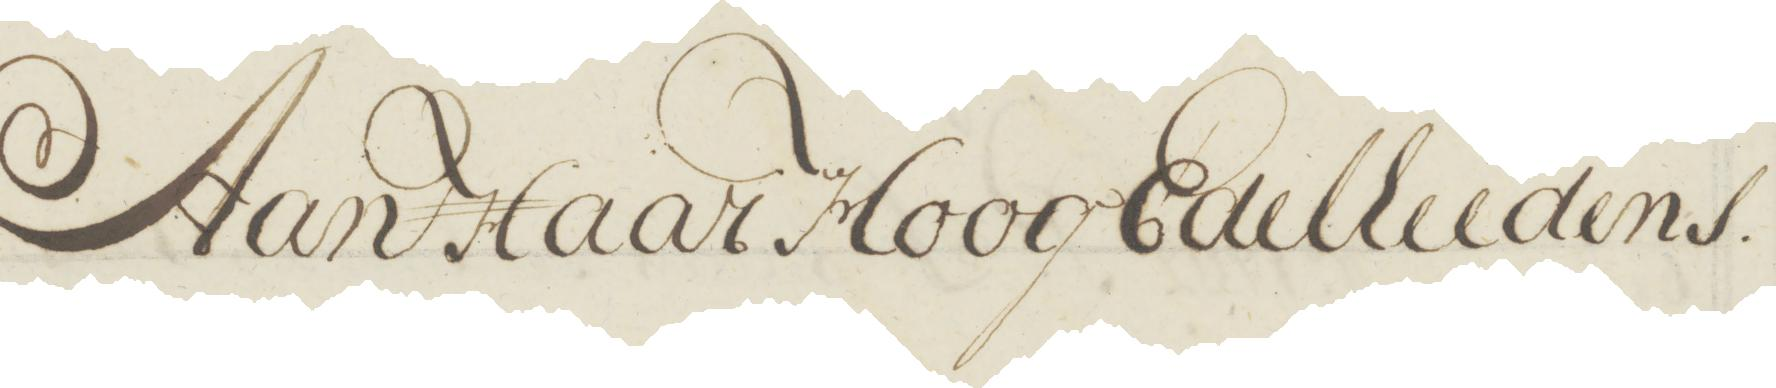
Aan Haar Hoog Edelheedens.
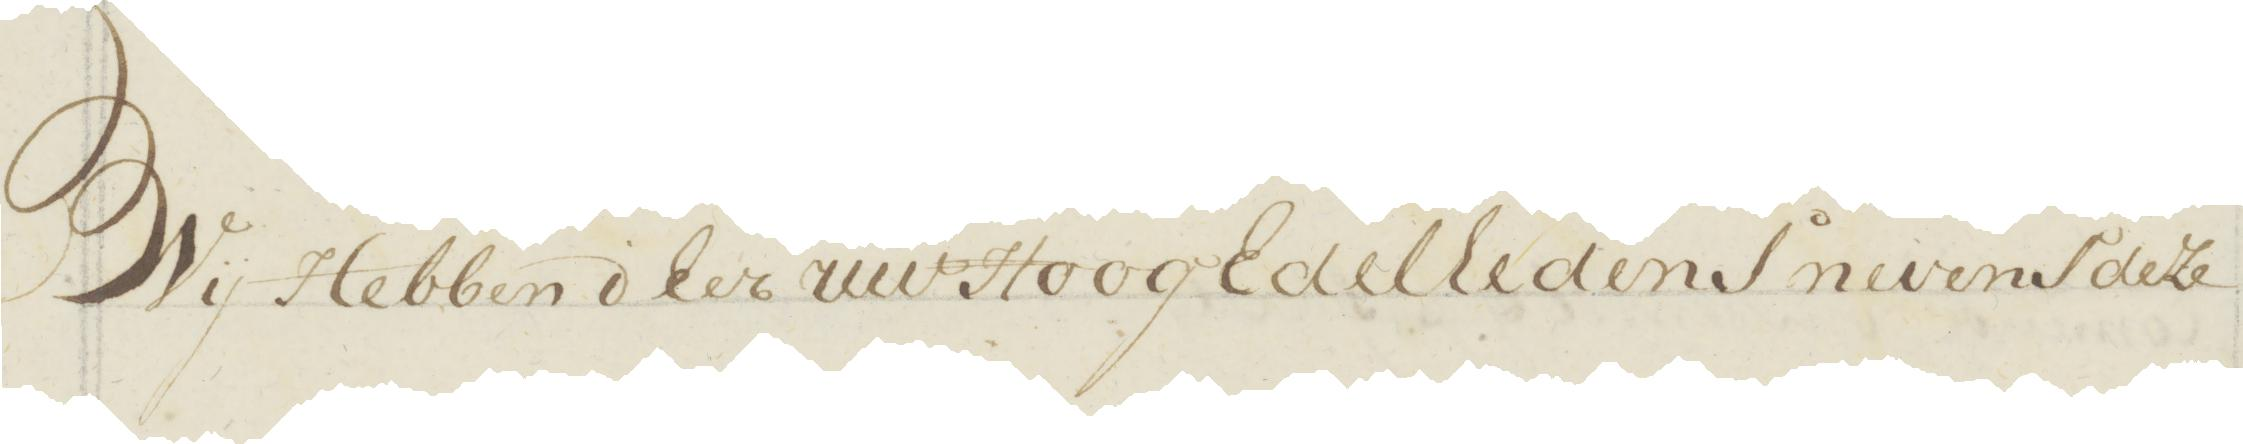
Wij Hebben d' Eer uw Hoog Edelhedens nevens deze
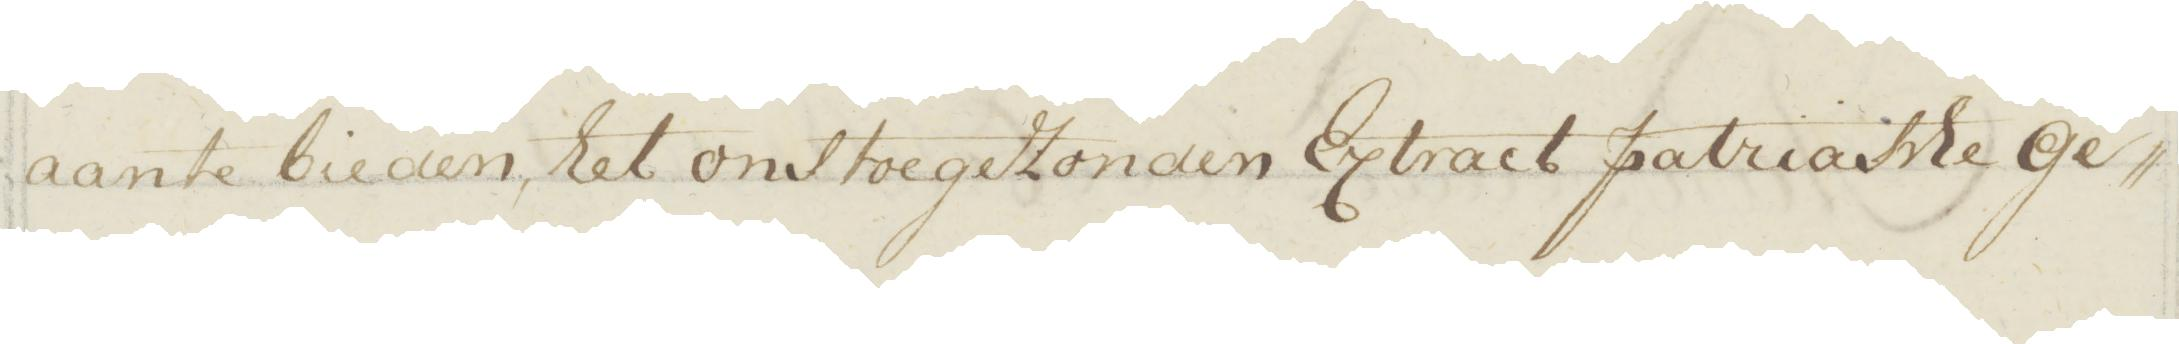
aan te bieden, het ons toegezonden Extract patriasche ge„
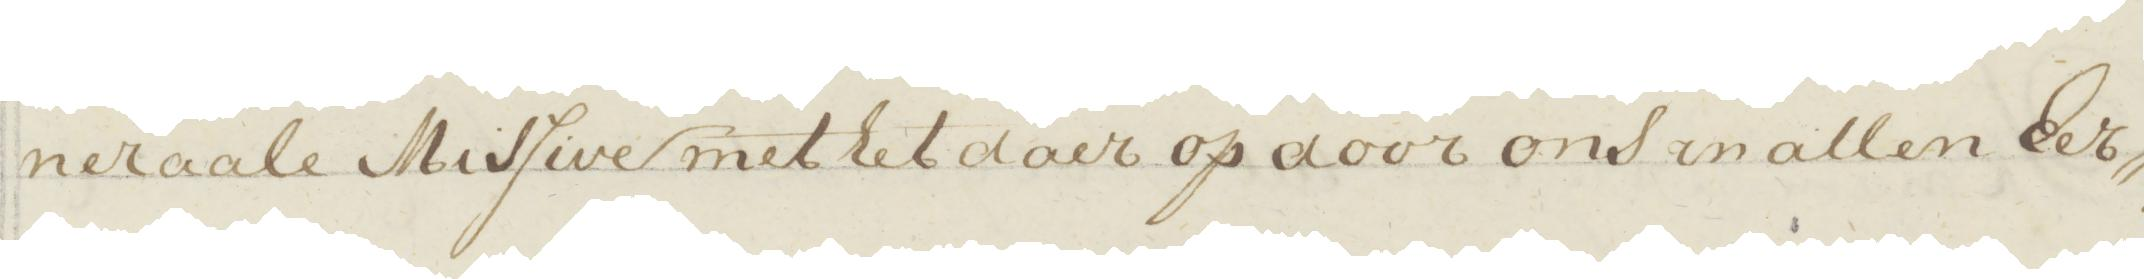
neraale Missive met het daer op door ons in allen Eer
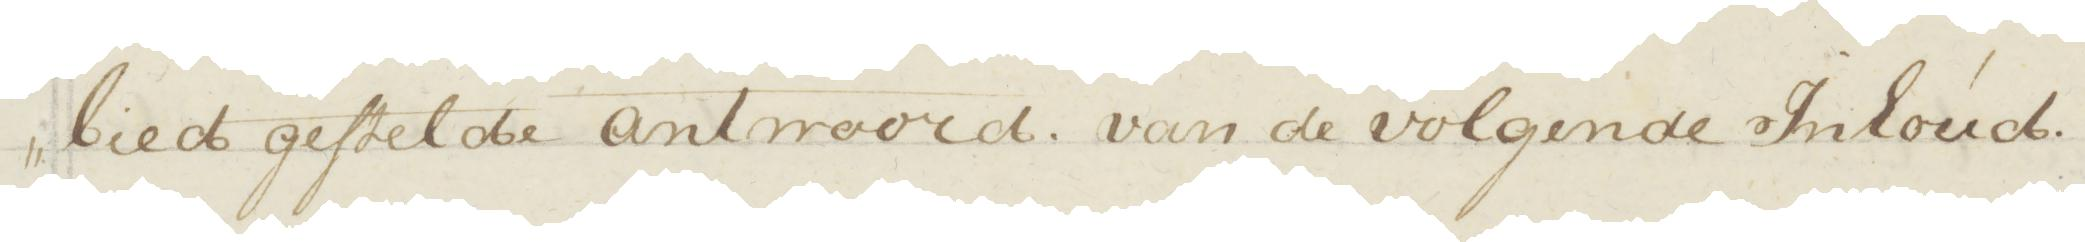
„bied gestelde antwoord. van de volgende Inhoud.
